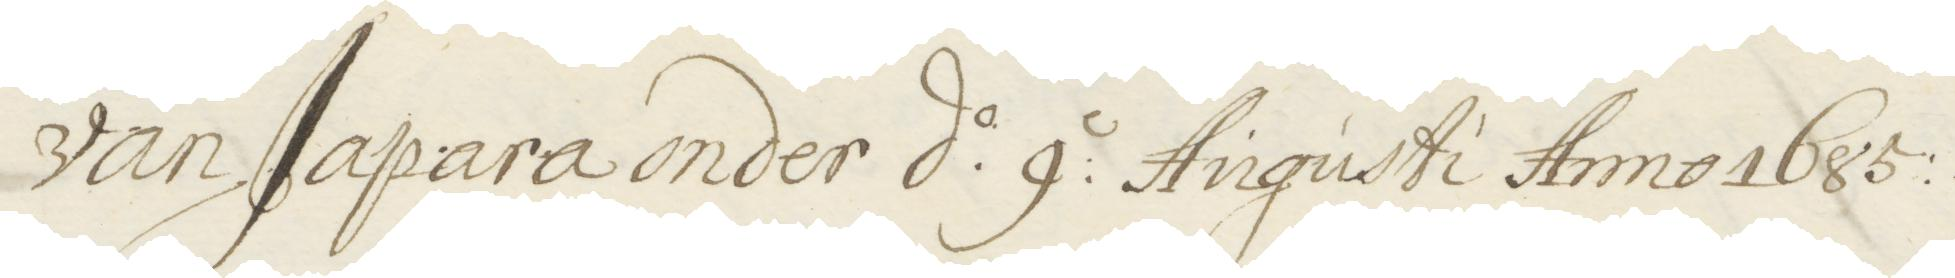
van Japara onder d.o 9:e Augusti Anno 1685:
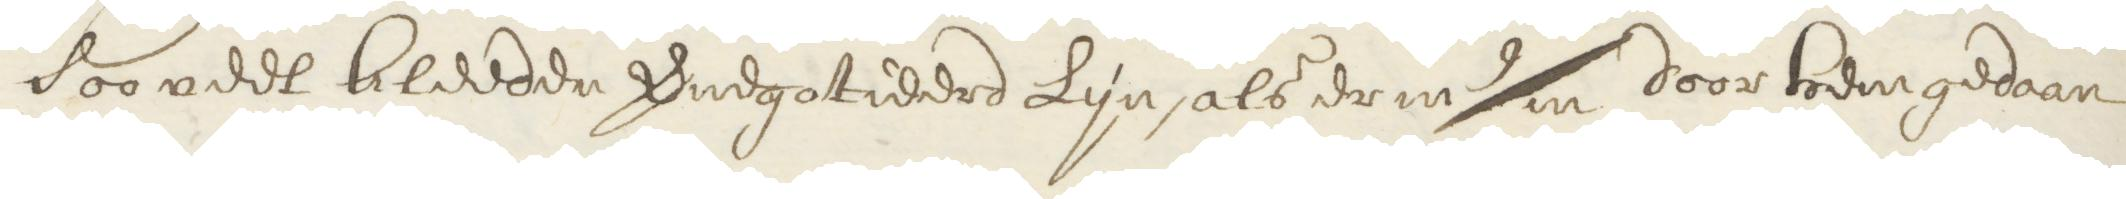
soo veel kleeden vernegotieerd zijn, als er in 9/m door hem gedaan
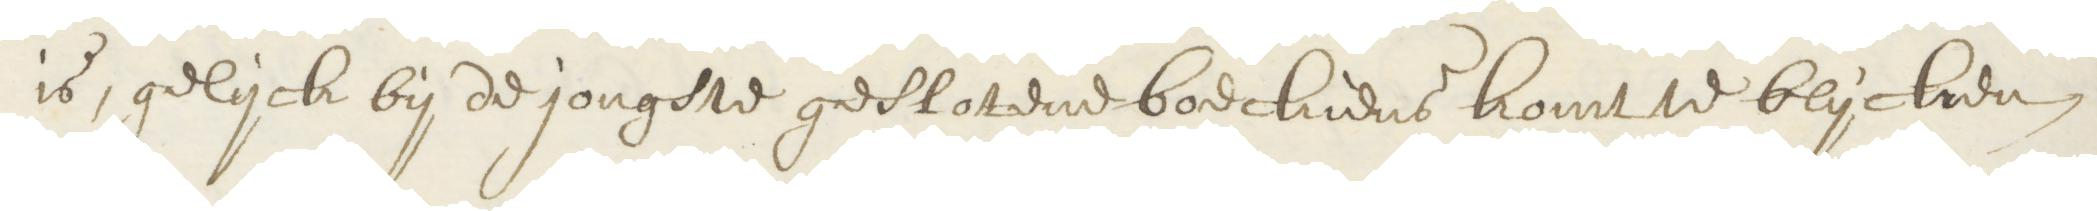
is, gelijck bij de jongste geslotene boeckiens komt te blijcken,
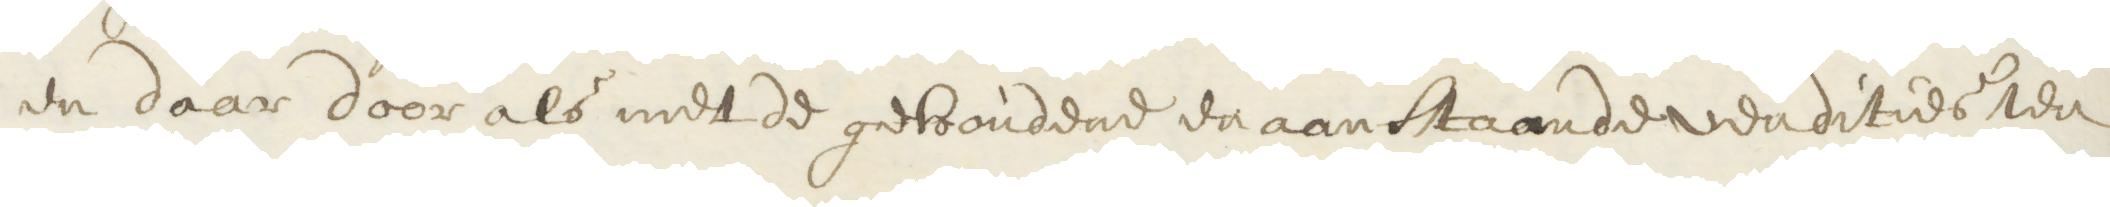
en daar door als met de gehoudene en aanstaande vendities ten
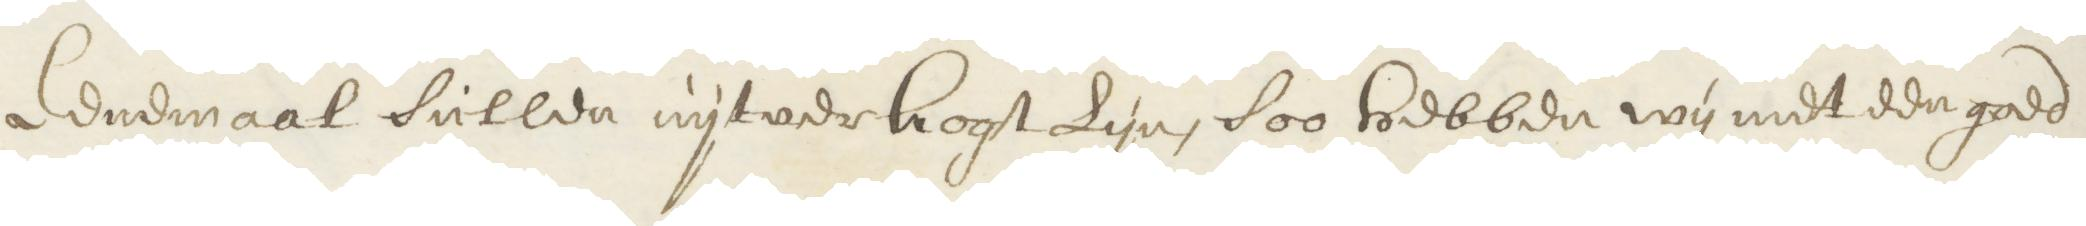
Eenemaal sullen uijtverkogt zijn, soo hebben wij met een goed
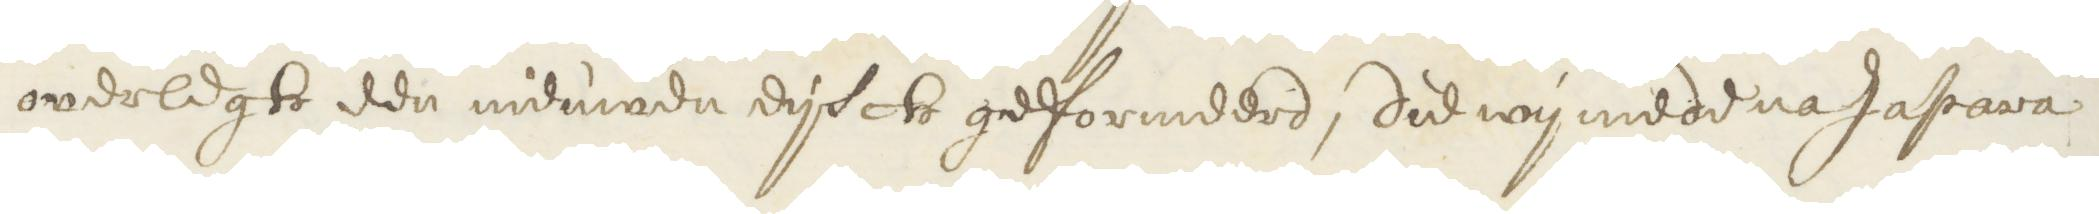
overlegh een nieuwen eijsch geformeerd, die wij mede na Japara
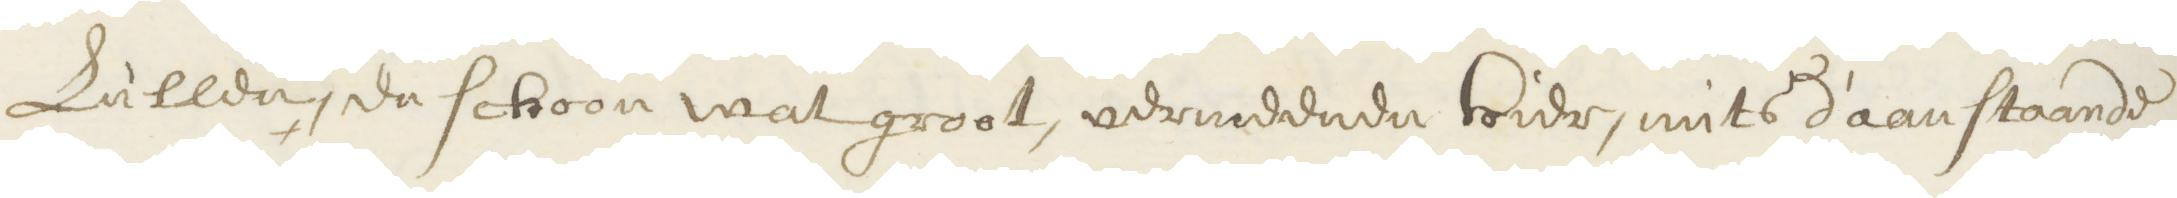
zullen, en schoon wat groot, vermeenen hier, mits d'aanstaande
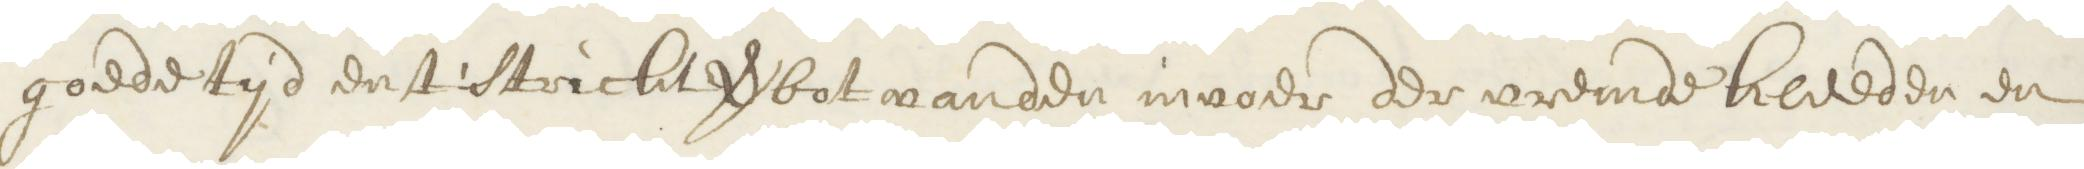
goede tijd en t' strickt verbot vanden invoer der vremde kleeden en
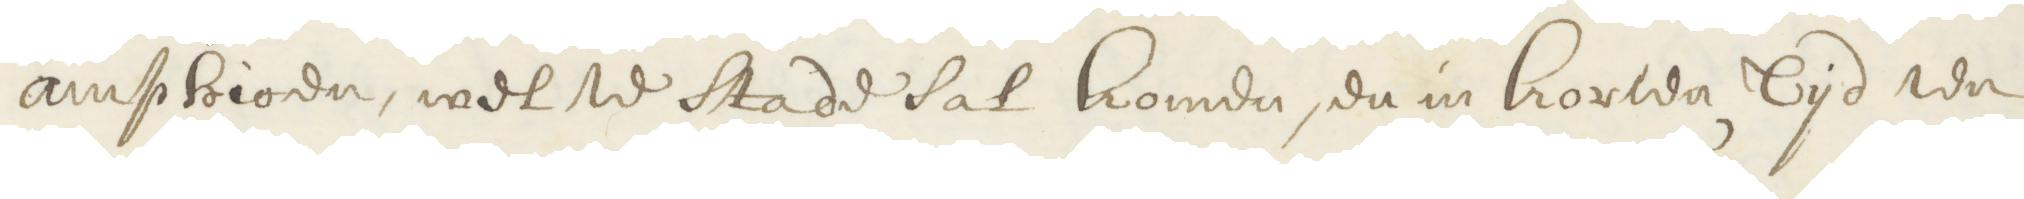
amphioen, wel te stade sal komen, en in korten tijd ten
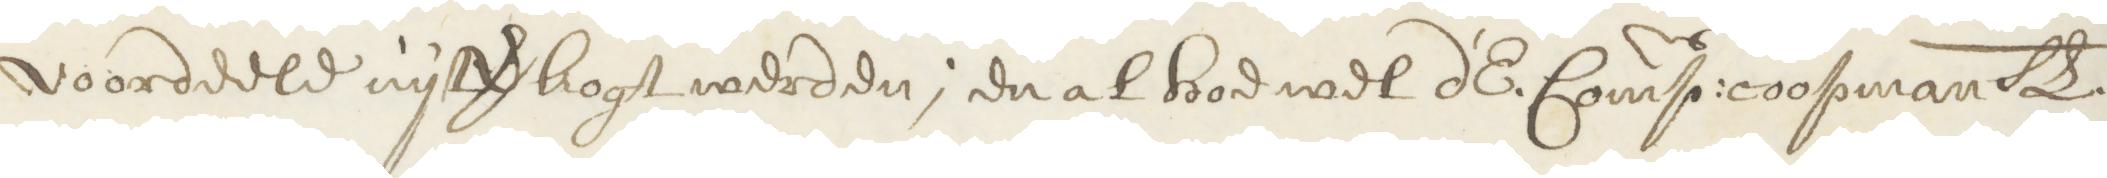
voordeele uijtverkogt werden; en al hoe wel d'E. Comp:s coopmansz
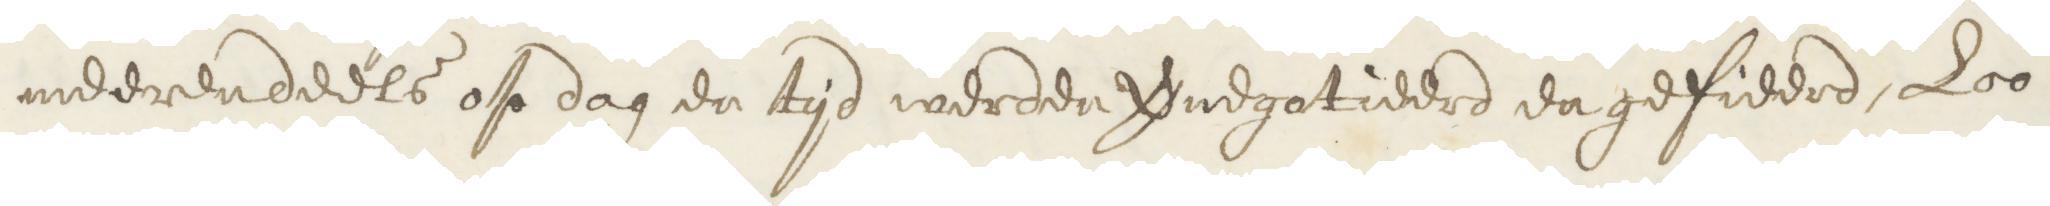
meerendeels op dag en tijd werden vernegotieerd en gefieerd, zoo
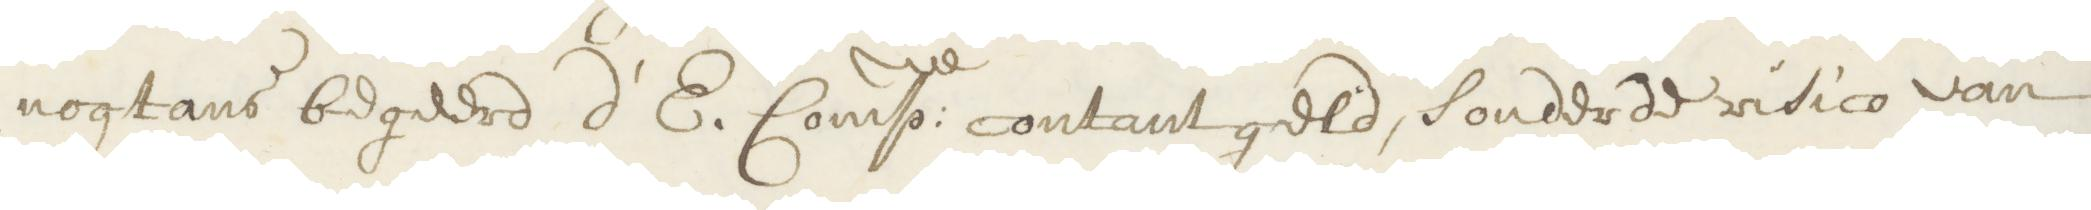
nogtans begeerd d’ E. Comp: contant geld, sonder de risico van
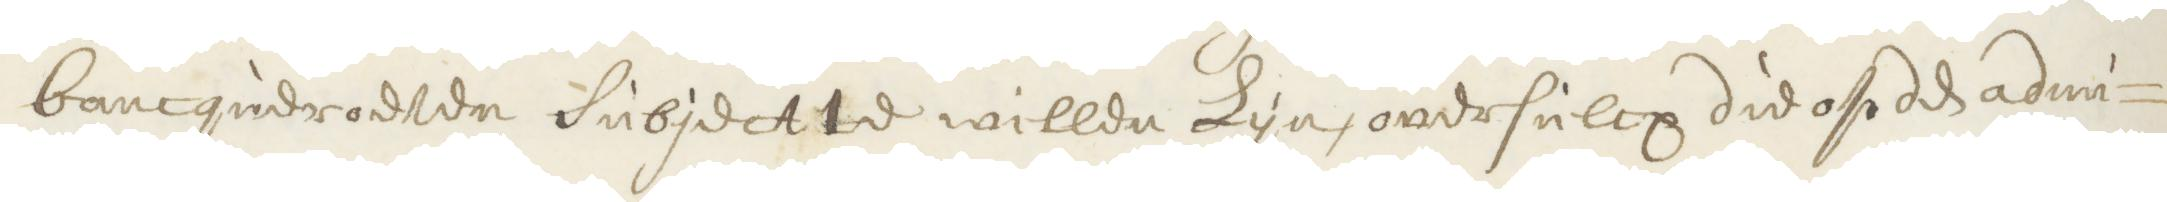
bancqueroeten subject te willen zijn, oversulcx die op den admi=
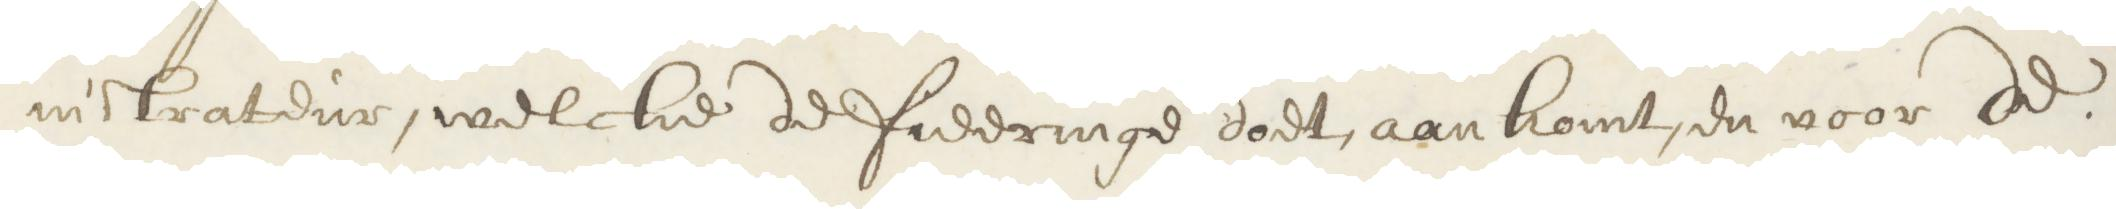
nistrateur, welcke de fieeringe doet, aan komt, en voor de
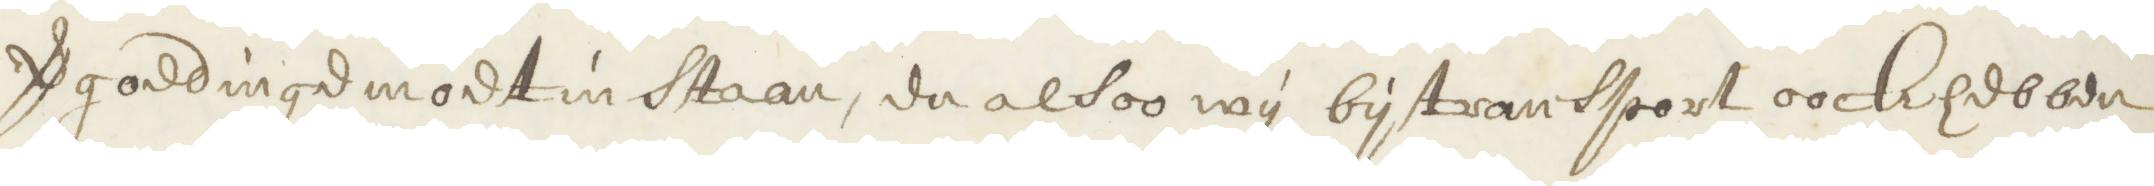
vergoedinge moet instaan, en alsoo wij bij transport oock hebben
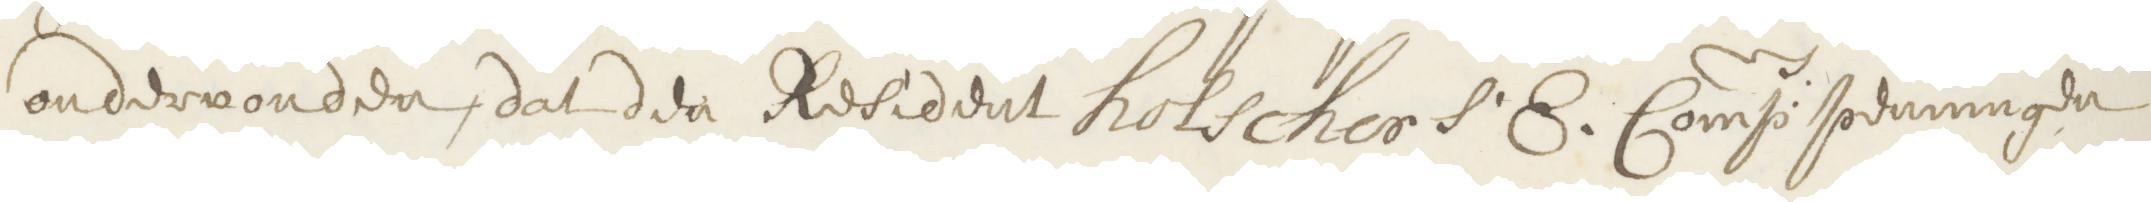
ondervonden, dat den Resident holscher s'E. Comp:s penningen
